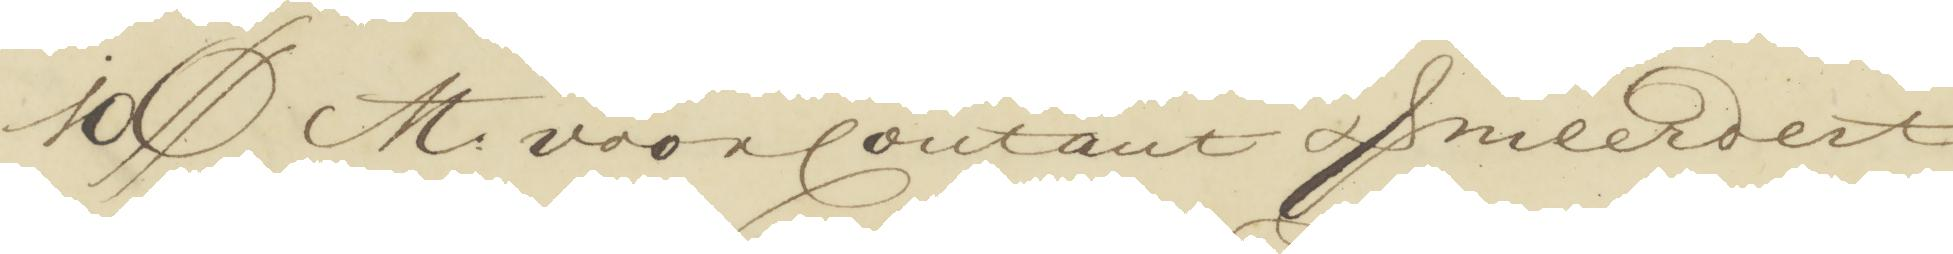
10 OM: voor contant vermeerdert
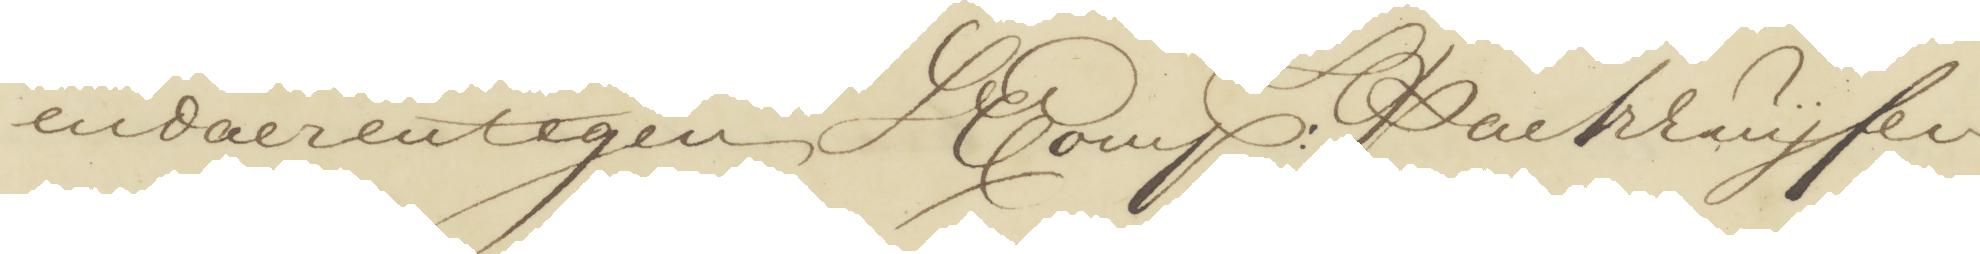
en daerentegen s EComp:s Packhuijsen
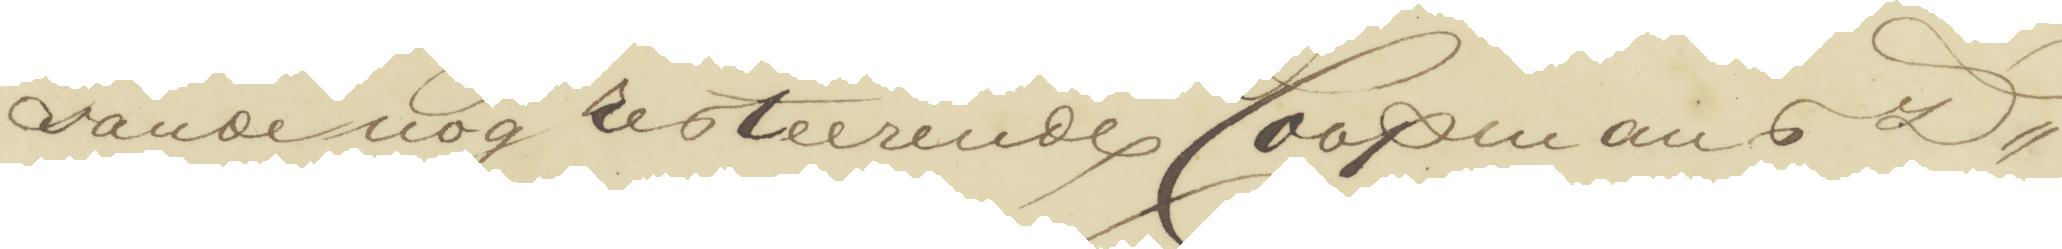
van de nog resteerende Coopmansz„
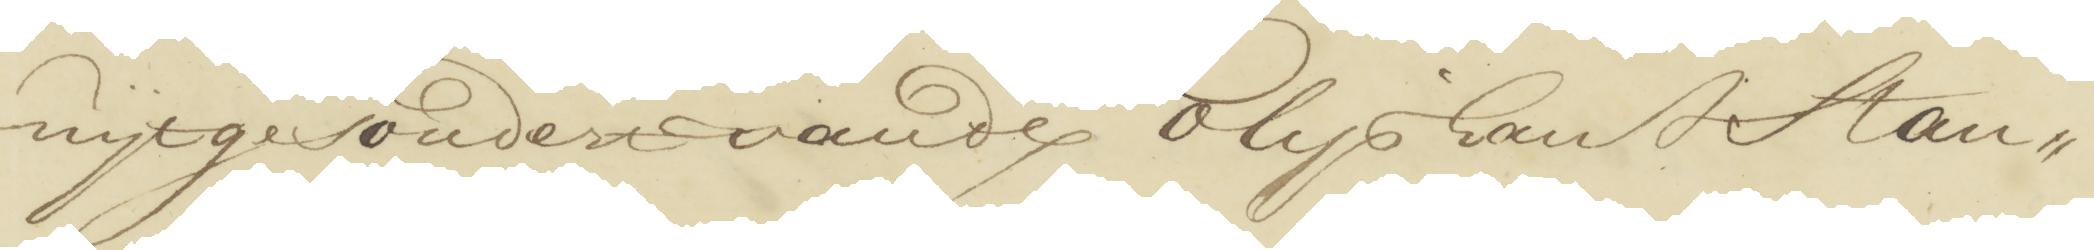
uijtgesondert van de oliplant Stan„
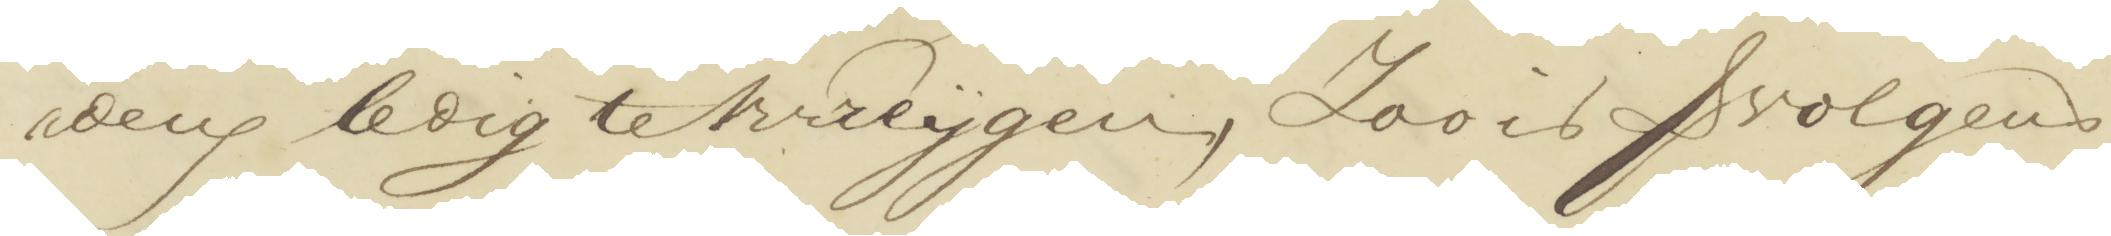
„den ledig te kreijgen zoo is vervolgen
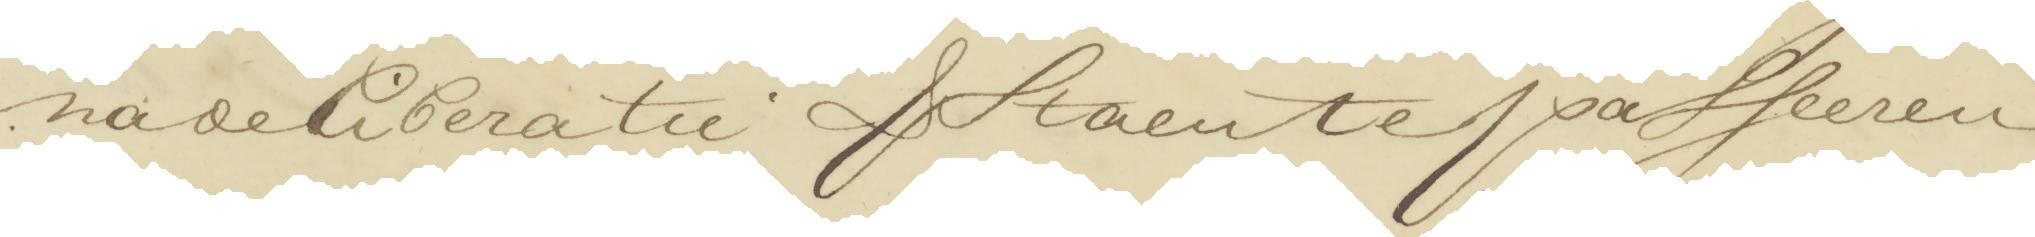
na de liberatie verstaen te passeeren
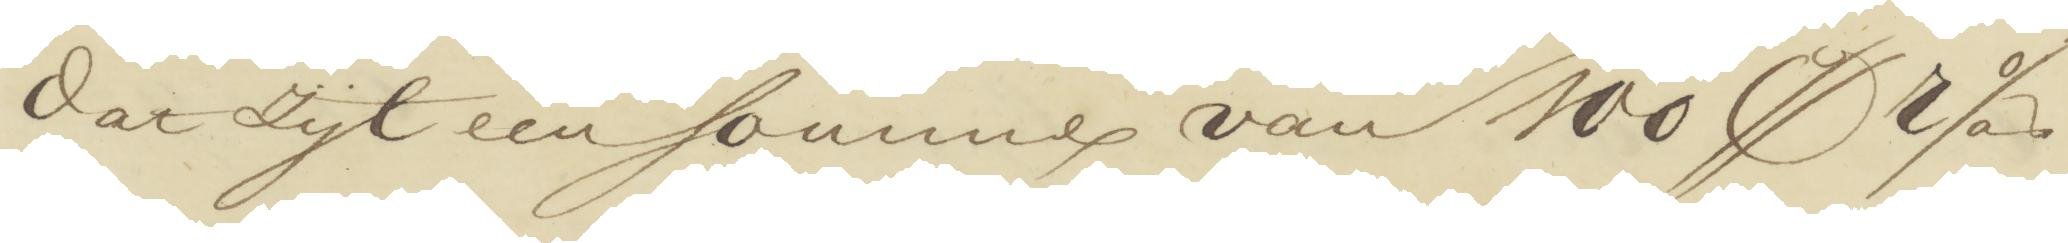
dat zijl een somme van 100 O Ro/a
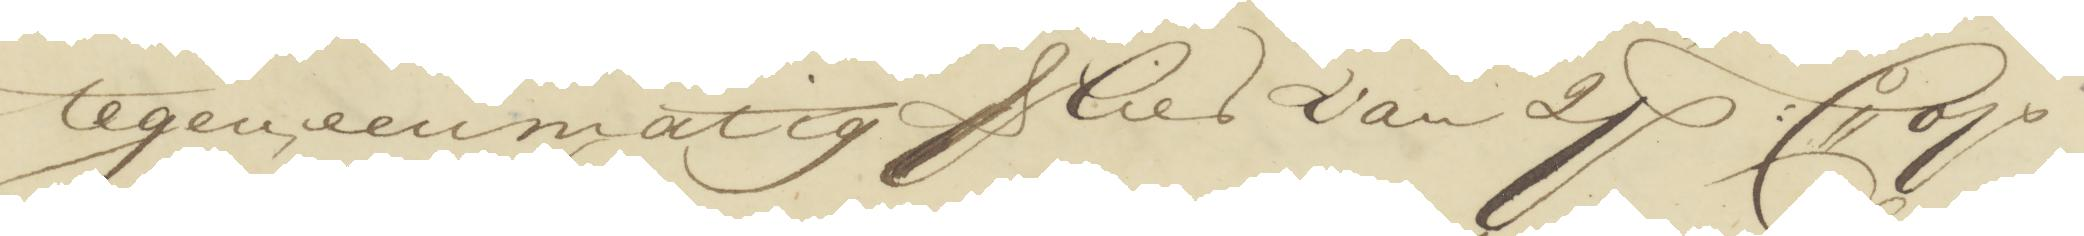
tegen een matig verlies van 2p:C„o op
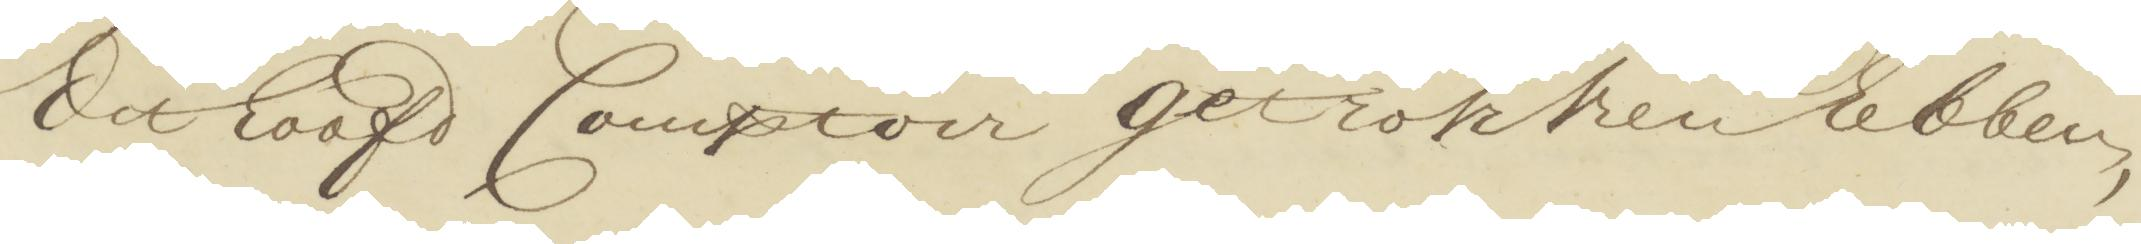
dit hoofd Comptoir getrokken hebben,
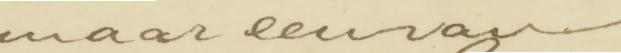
maar een van
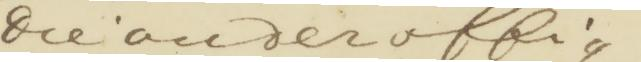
die onder offi„
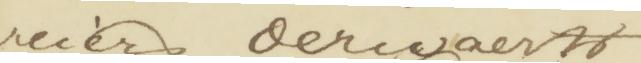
cier derwaerts
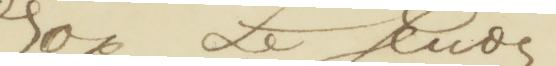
op te senden
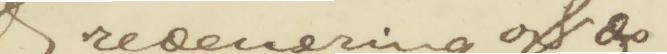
redenering over den
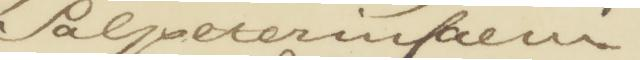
salpeterinsaem
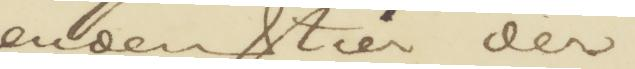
en den vertier der
